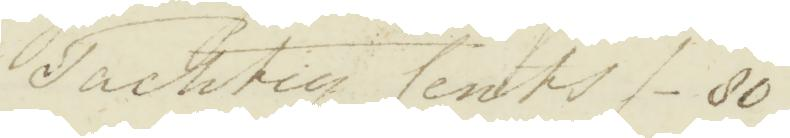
Tachtig Cents ƒ - 80
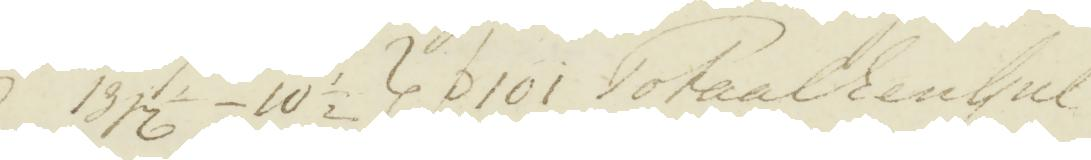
13/c=t - 10½ ƒ101 Totaal Een Gul
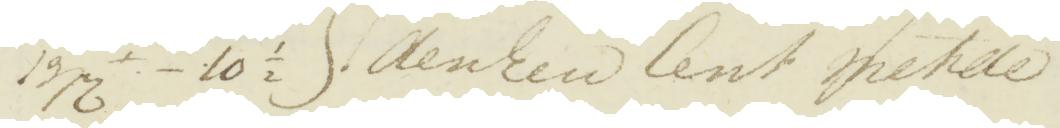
13/c=t - 10½ den Een Cent metde
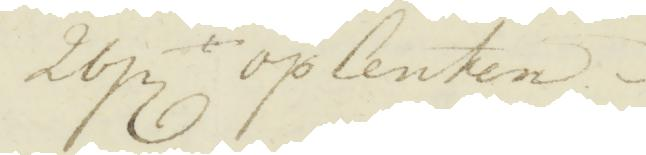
26/c=t op Centen.
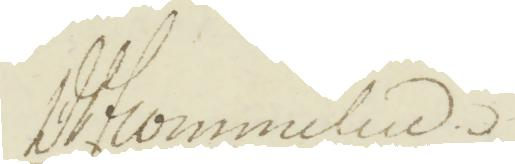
D.F.Crommelin. -
